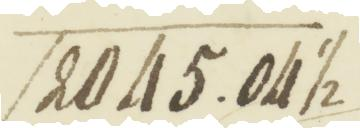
2045.04½
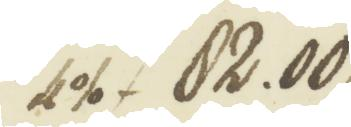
4% ƒ 82.00.
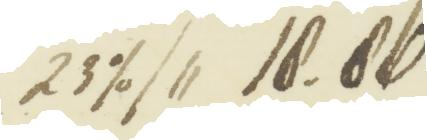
23% „ 18. 86
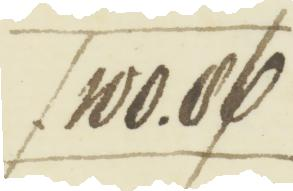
ƒ100.86
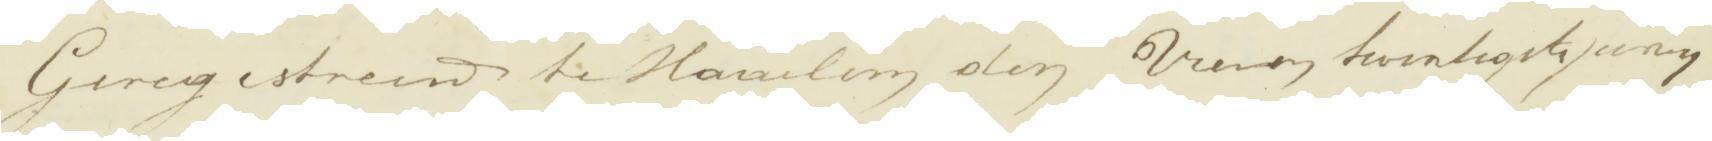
Geregistreerd te Haarlem den Vieren twintigste juny
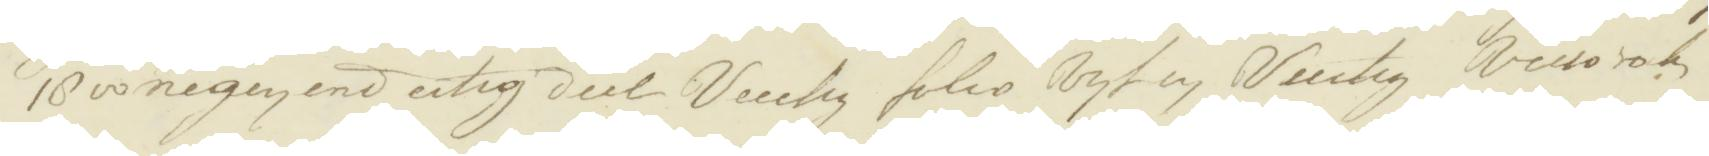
1800 negen endertig deel Veertig folio Vyf en Veertig Verso vak
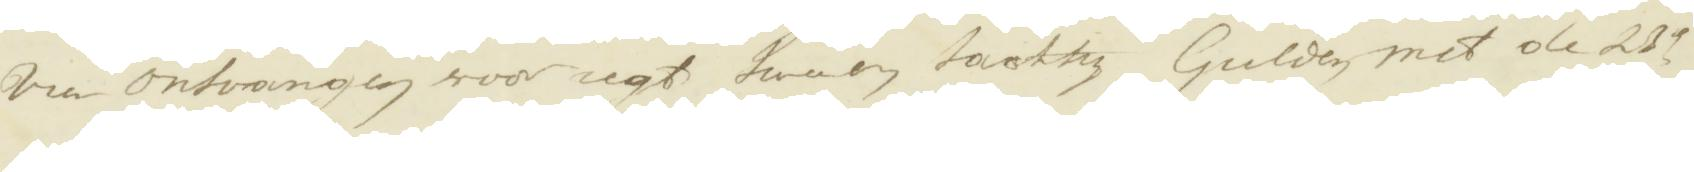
vier ontvangen voor regt twee en tachtig Gulden met de 23%
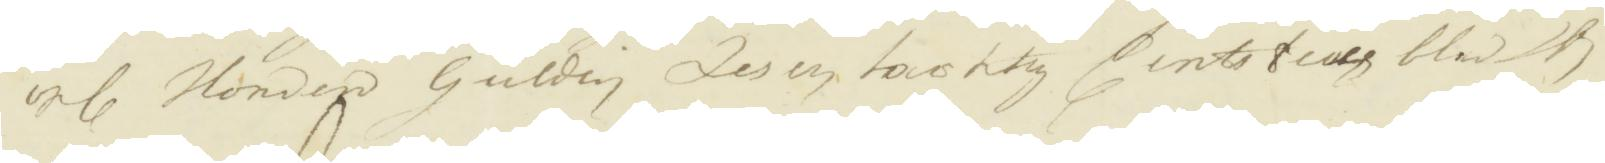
opc Honderd Gulden zes en tachtig Cents twee blad ZR
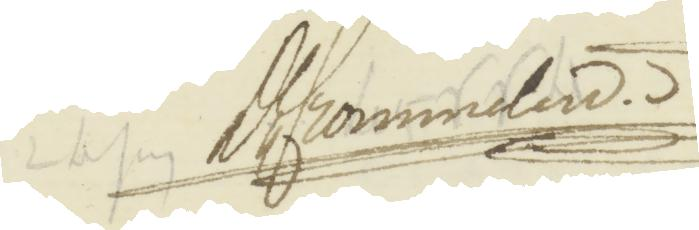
DFCrommelin. )
